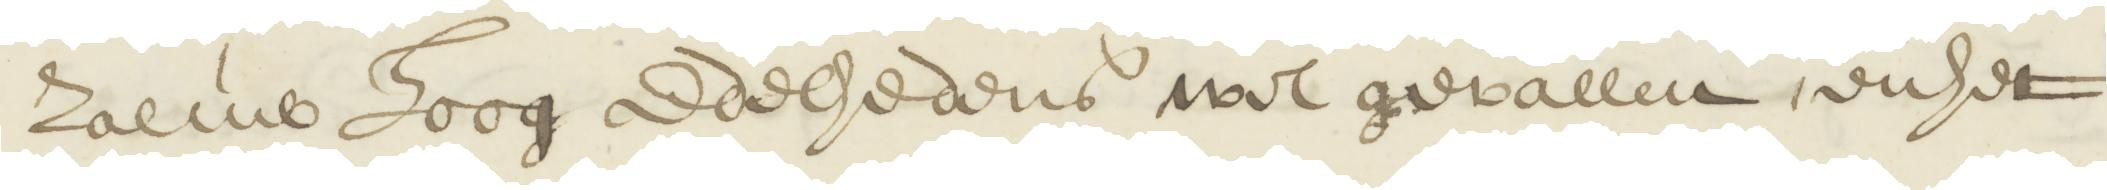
zal uw Hoog Edelhedens wel gevallen, en het
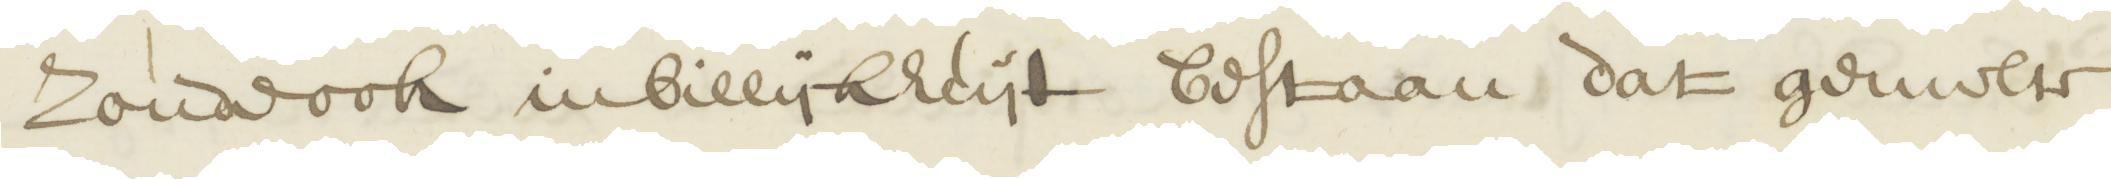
zoude ook in billijkheijt bestaan dat gemelte
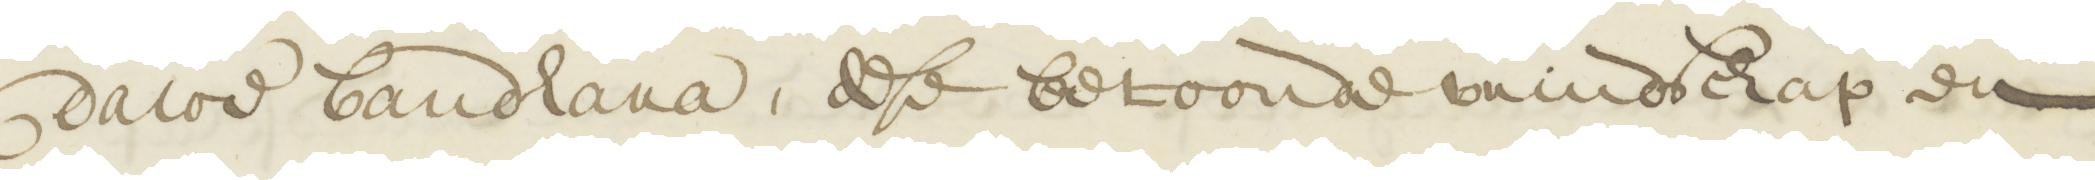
datoe bandhara, dese betoonde vrindschap en
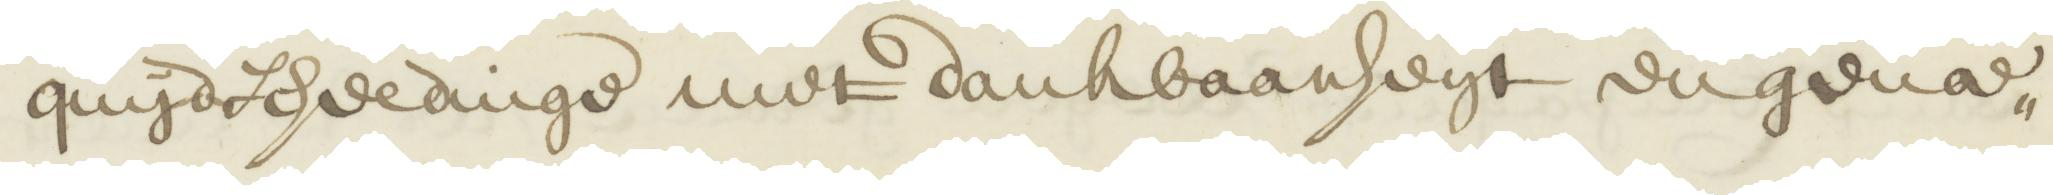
quijdscheldinge met dankbaarheijt en genoe„
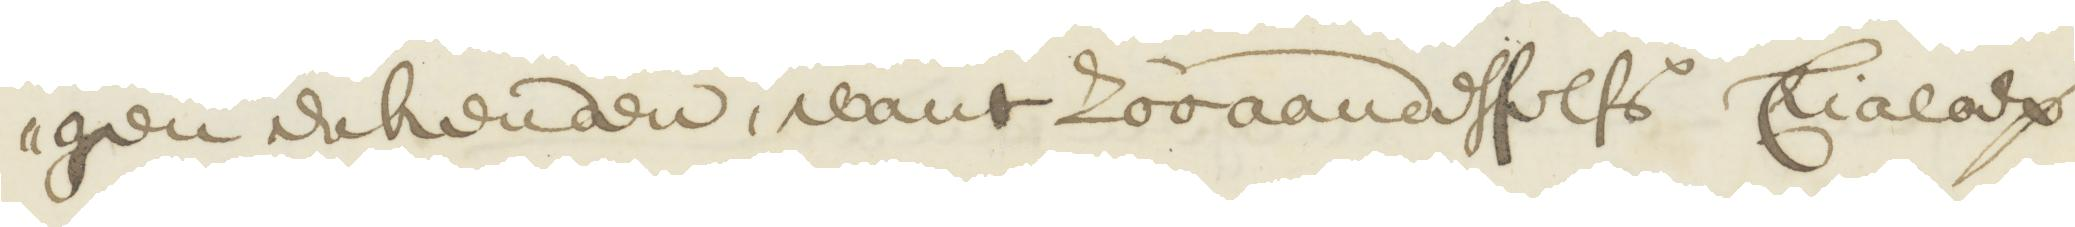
„gen erkenden, want zoo aan desselfs Chialoep
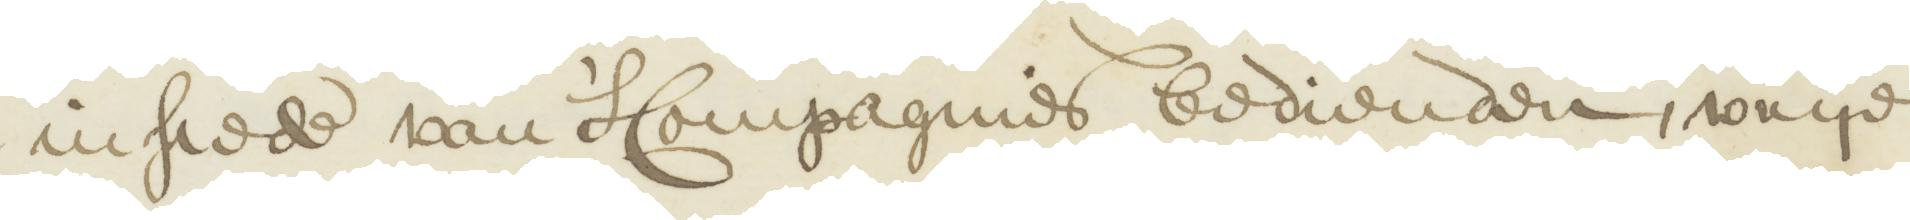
in stede van ’s Compagnies bedienden, vrije
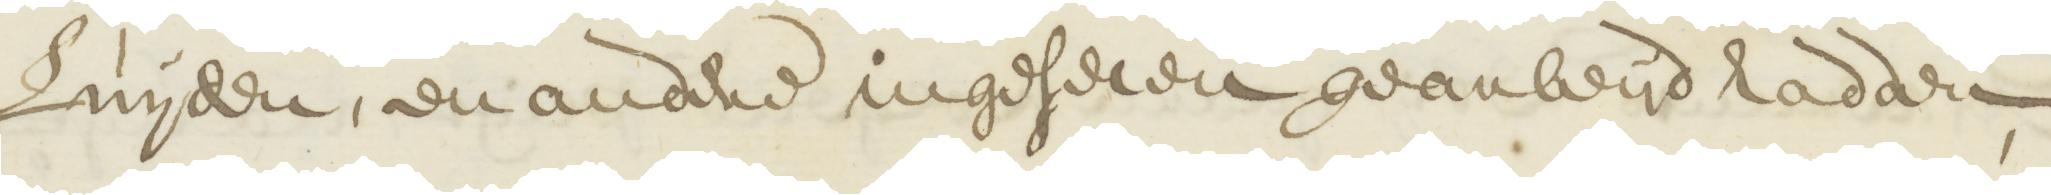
Luijden, en andere ingeseten gearbeijd hadden
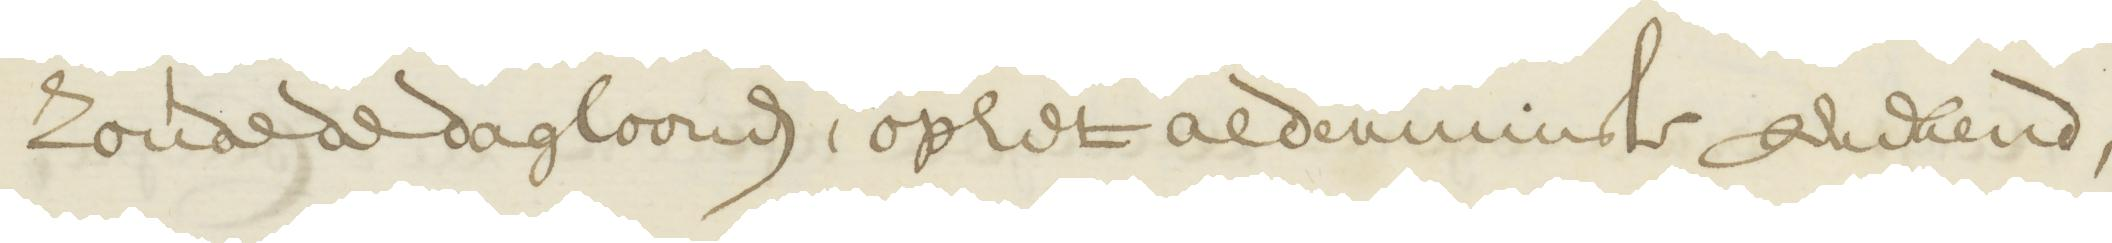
zoude de dagloonen, op het alderminste gerekend,
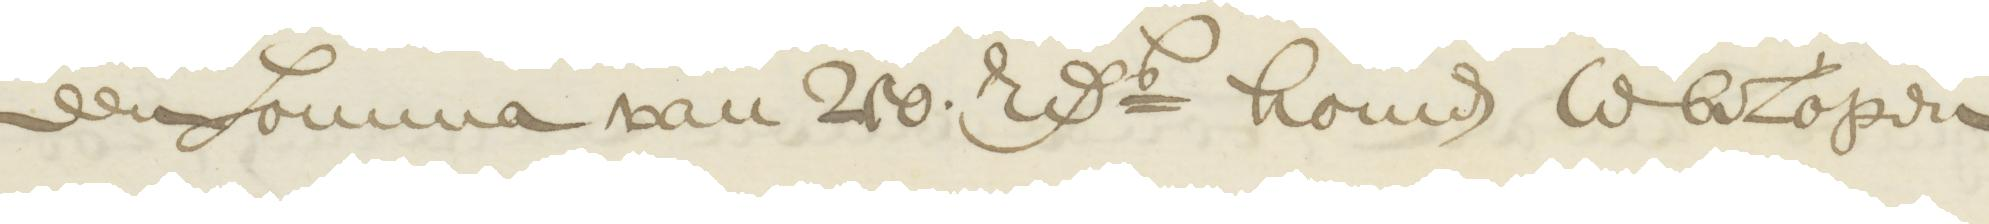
een somma van 250. rd=s komen te belopen
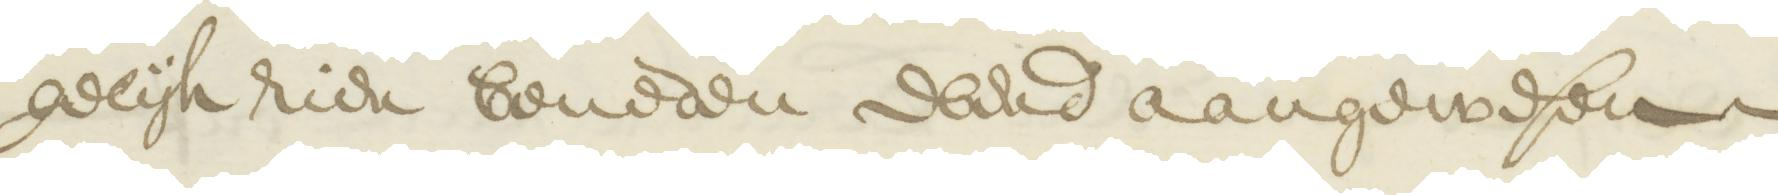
gelijk hier beneden werd aangewesen
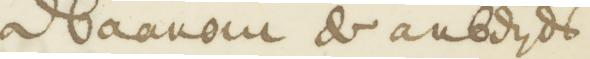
waarom de arbeijds
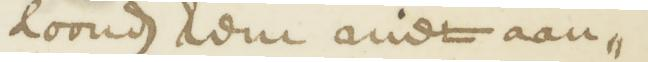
loonen hem niet aan„
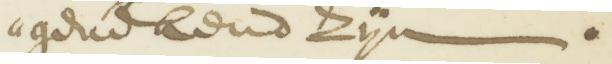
„gerekend zijn.
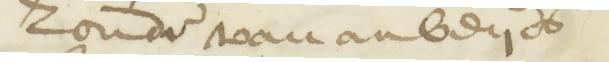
zoude van arbeijds
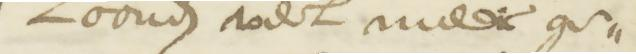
Loonen vel meer ge„
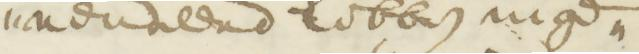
„rendeerd hebben inge„
